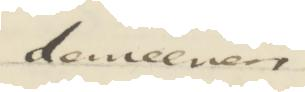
dencelven
